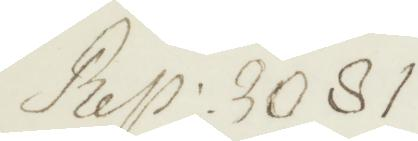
Rep: 3081
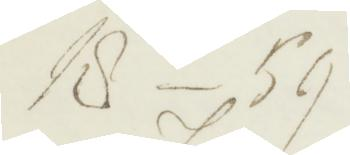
18 6/7 59
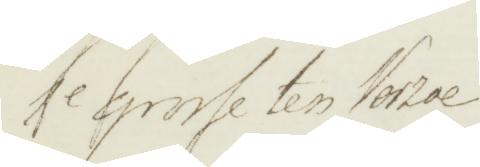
1e Grosse ten Verzoe
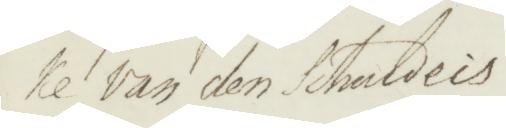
ke van den schuldeis
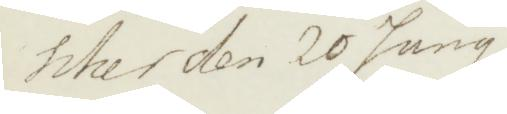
scher den 20 Juny
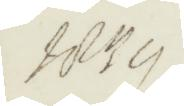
1879
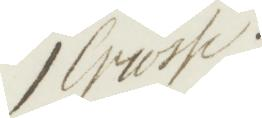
1 Grosse
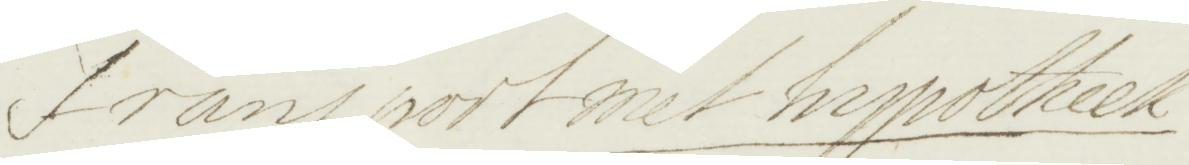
Transport met hypotheek
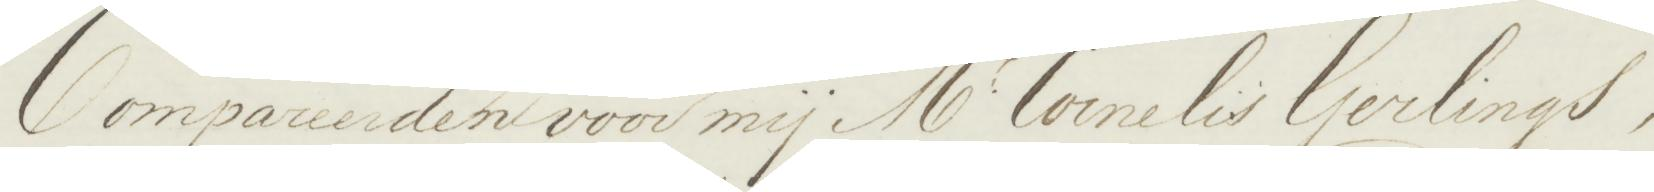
Compareerden voor mij M:r Cornelis Gerlings,
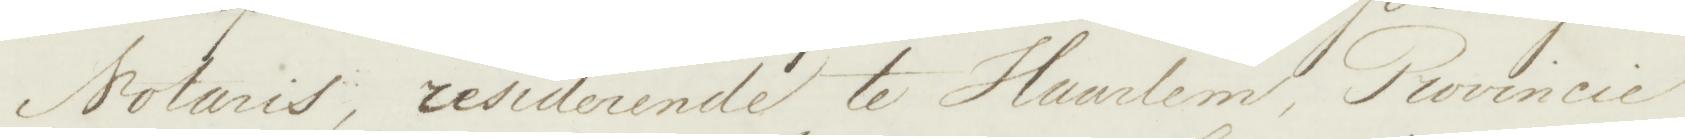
Notaris, residerende te Haarlem, Provincie
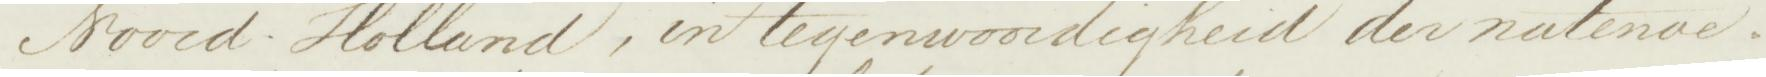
Noord Holland, in tegenwoordigheid der natenoe„
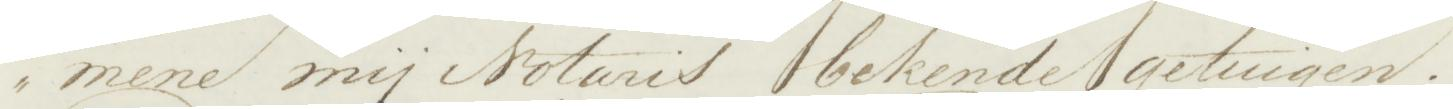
„ mene mij Notaris bekende getuigen.
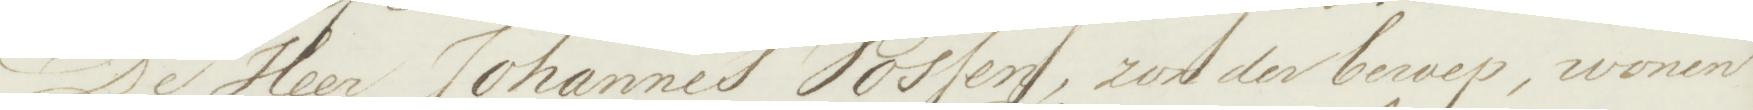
De Heer Johannes Vossen, zonder beroep, wonen
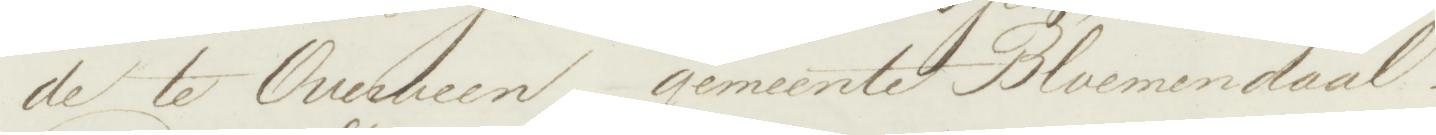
de te Overveen, gemeente Bloemendaal
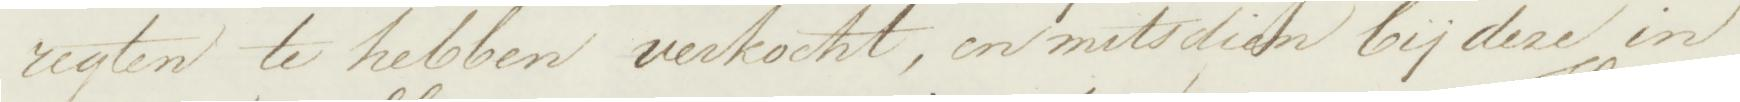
regten te hebben verkocht, en mitsdien bij deze in
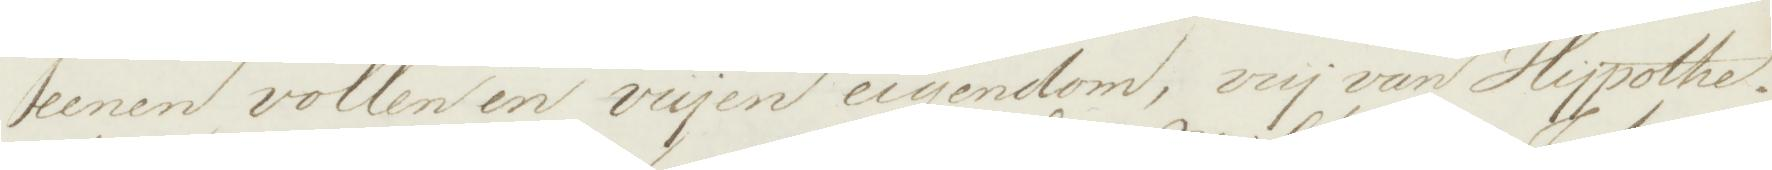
eenen vollen en vrijen eigendom, vrij van Hijpothe„
